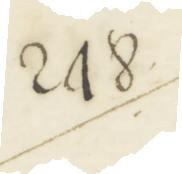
248:
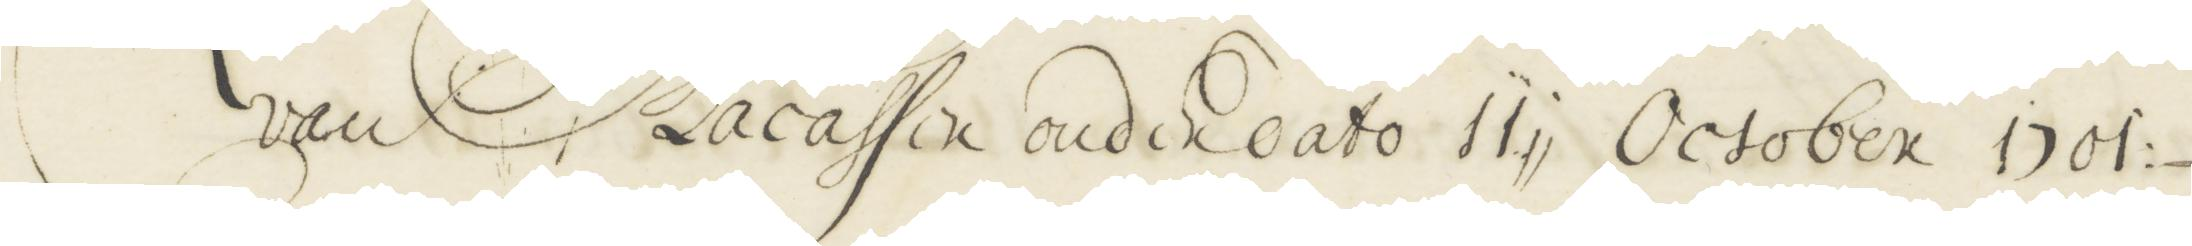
van Macasser onder dato 11„' October 1701:—
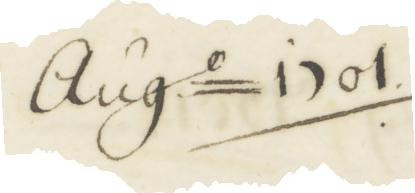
Aug=o 1701.
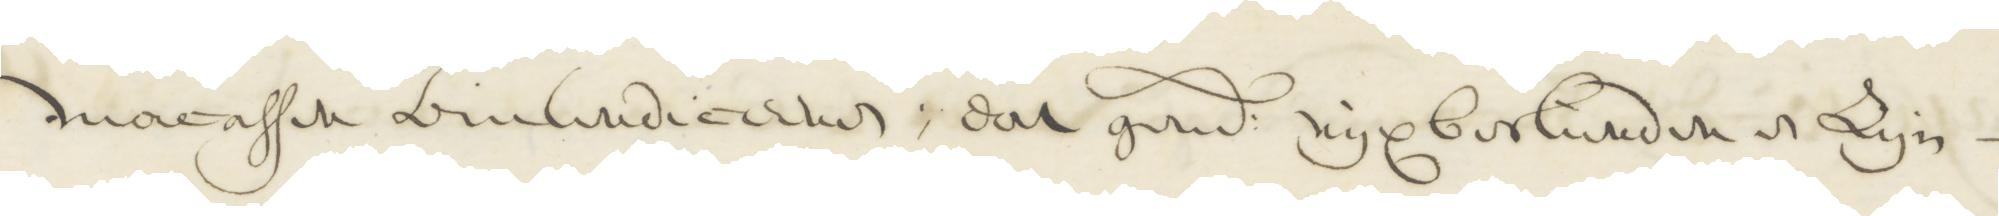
macasser te interdiceeren, dat gene: rijx besturder en Zijn
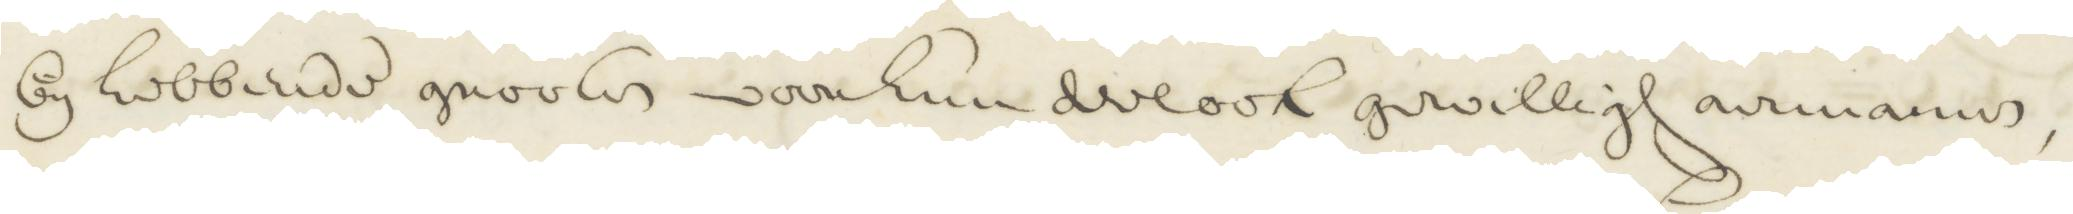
bij hebbende grooten voor hun deel ook gewilligh aennamen,
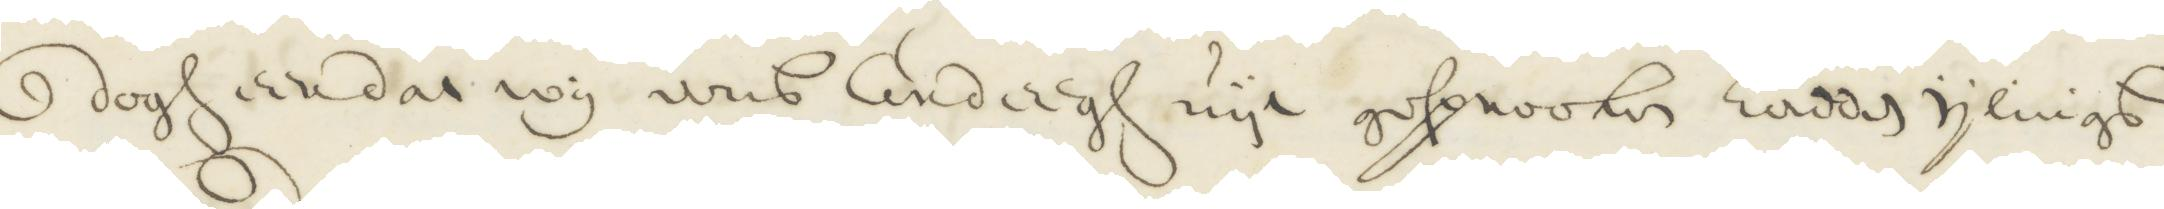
dogh eer dat wij eens terdeegh uijt gesprooken hadden ijlings
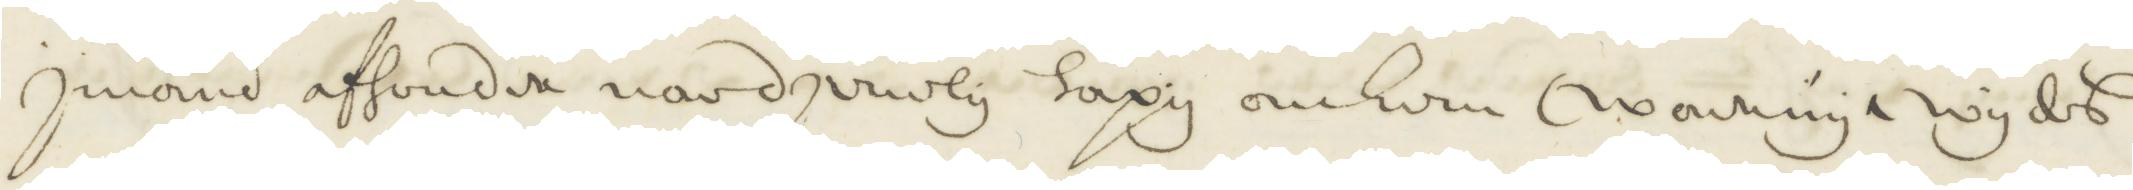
Jmand afsonden nae djenelij sapij om hem ( waeruijt wij des
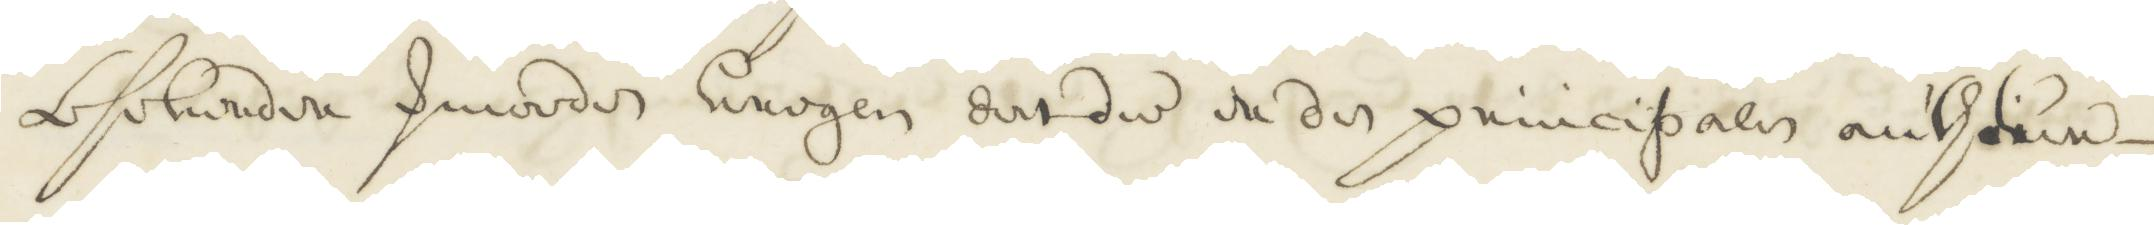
te sekerder vermoeden kregen dat die er den principalen autheur
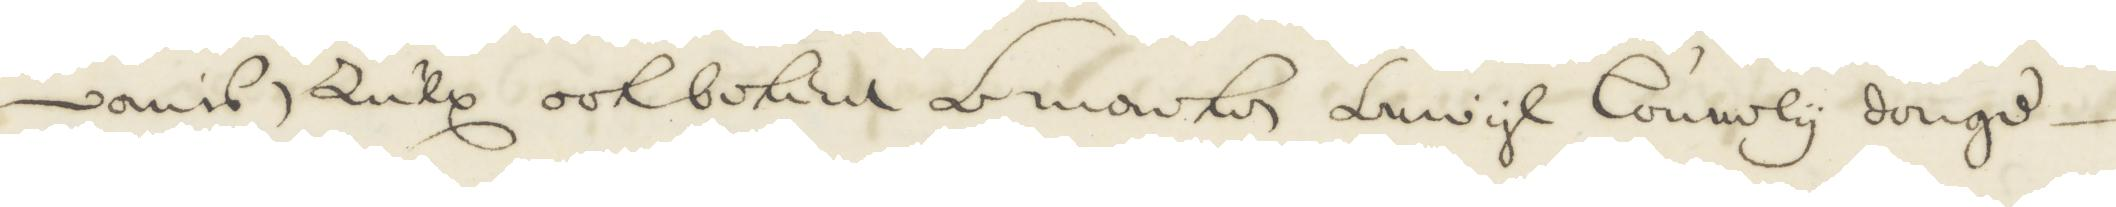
van is, Zulx ook bekent te maeken terwijl Tourelij donge
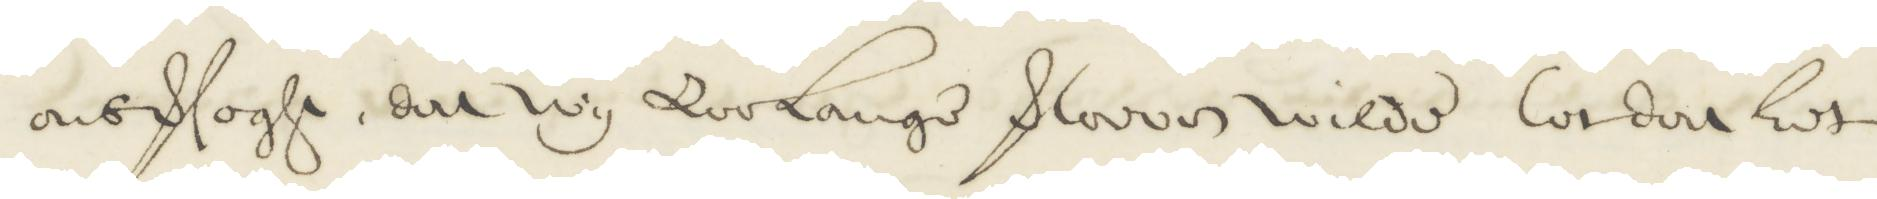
ons versogh, dat wij Zoo Lange vertoeven wilde tot dat het
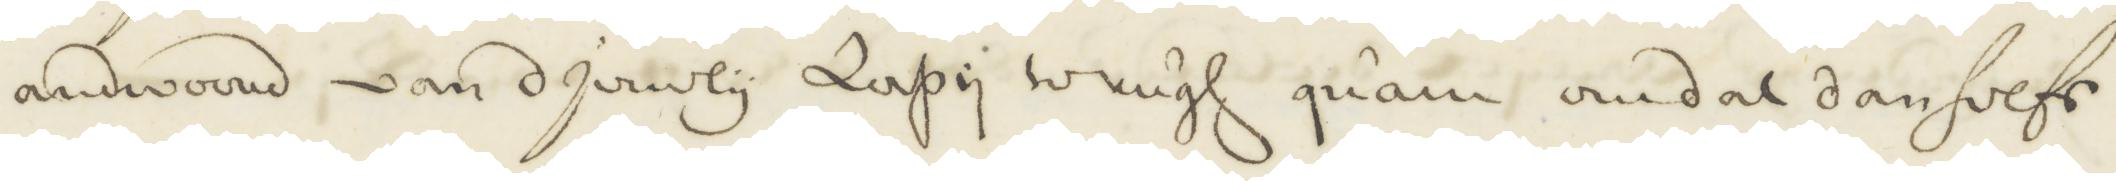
andwoord van djenelij Zapij terugh quam, om dat dan selfs
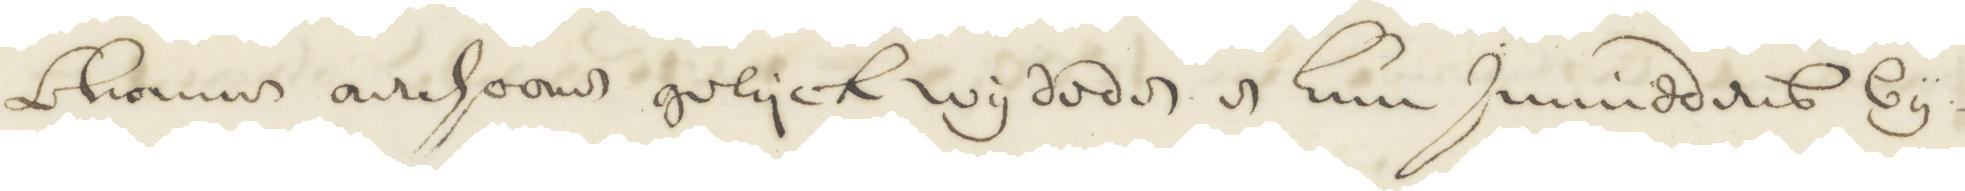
te konnen aenhooren gelijck wij deden en hun Inmiddens bij
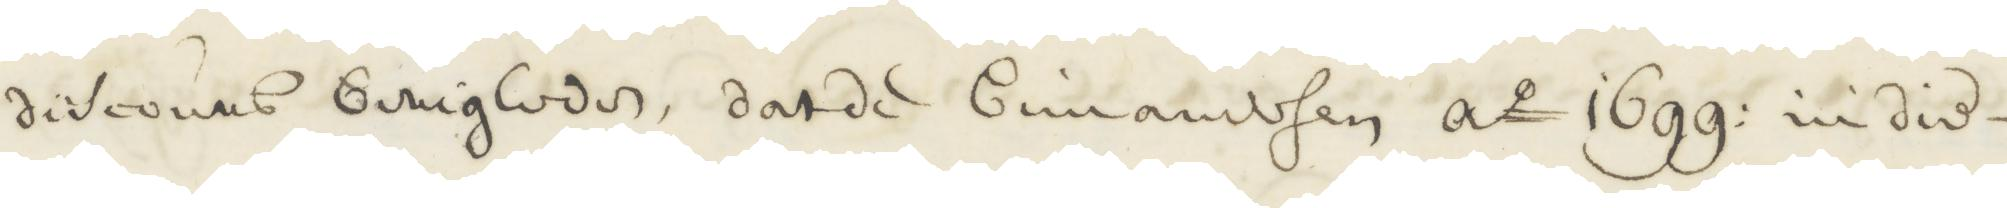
discours berigteden, dat de bimaneesen a=o 1699: in die
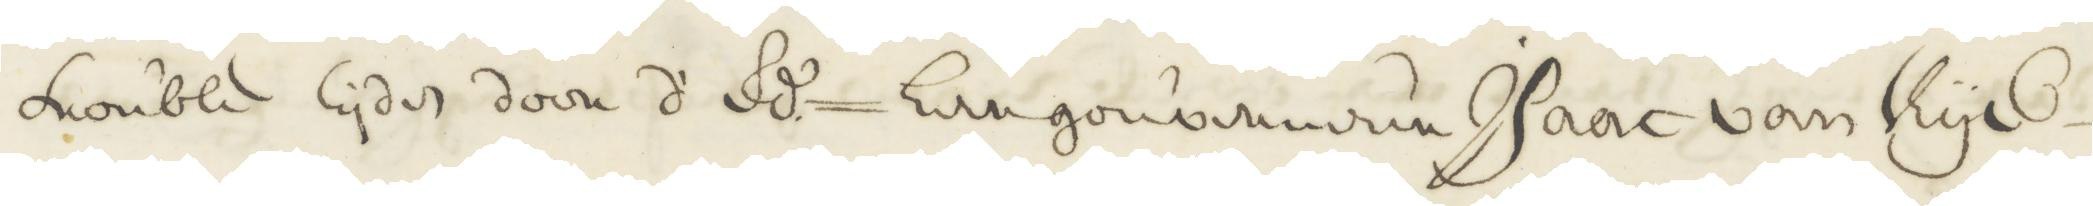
trouble tijden door d’ Ed= heer gouverneur Isaac van thije
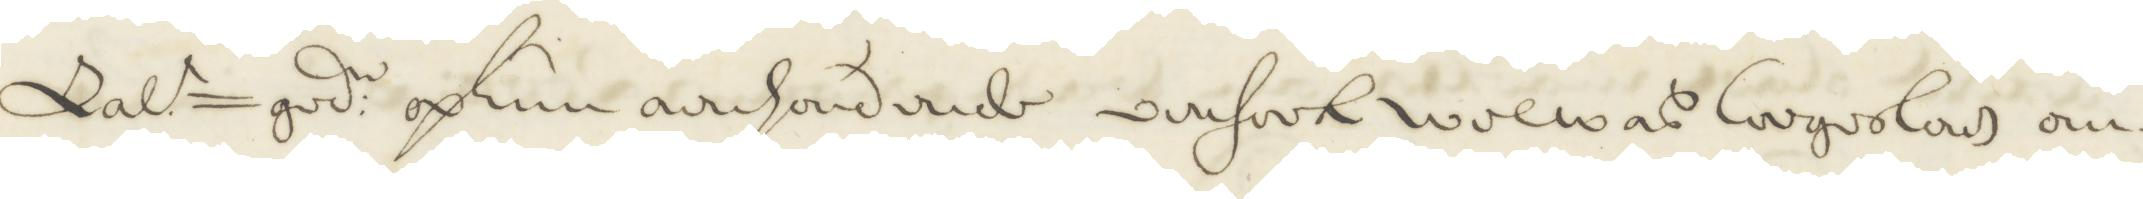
Zal=r ged:e op hun aenhoudende versoek wel was toegestaen om
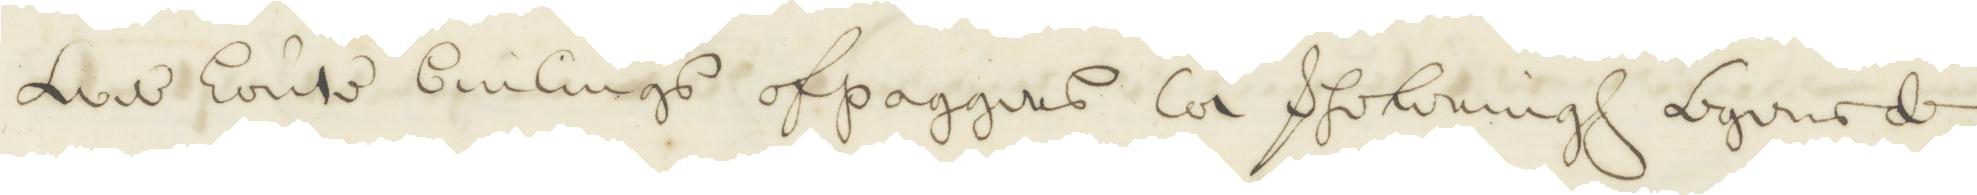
twee houte bintings of paggers tot versekeringh tegens de
